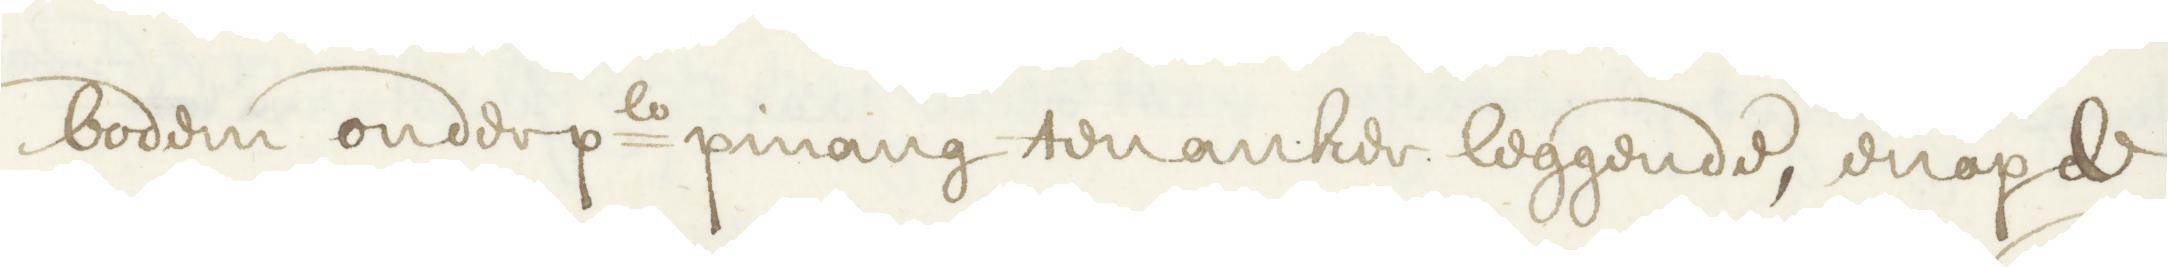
bodem onder p=lo pinang ten anker leggende, en op de
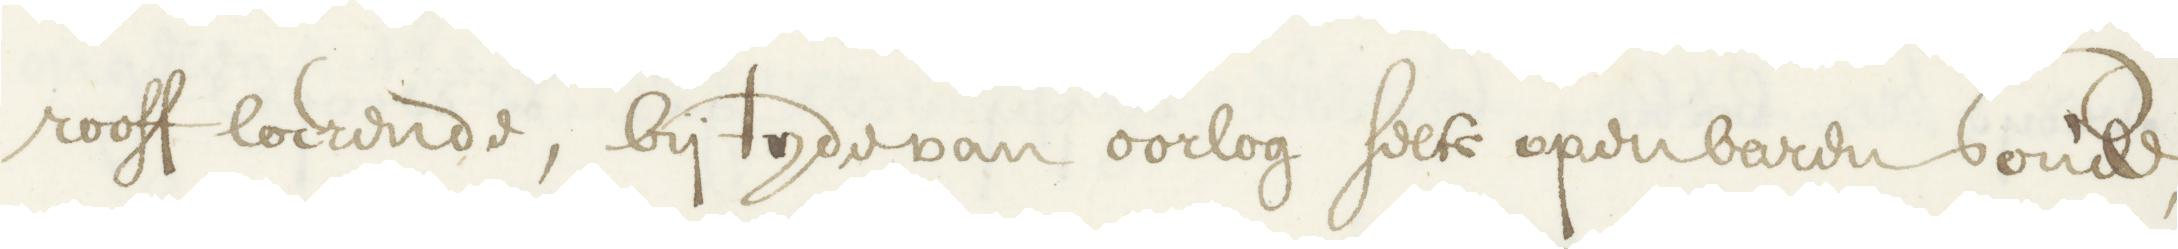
rooff loerende, bij tyde van oorlog selfs openbaren soude
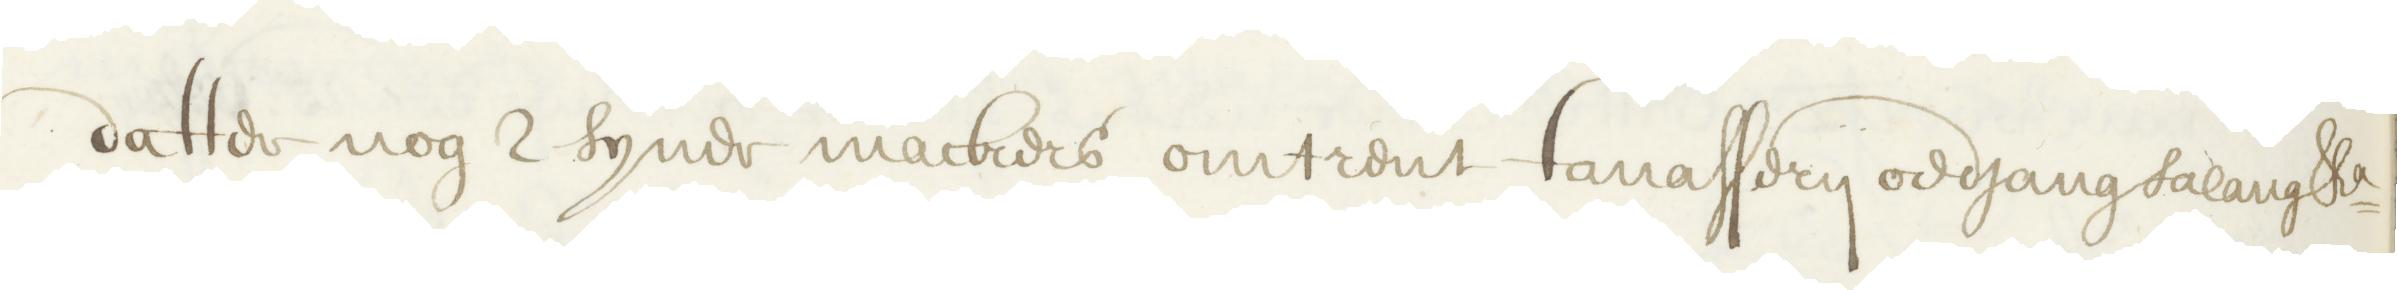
datter nog 2 syner mackers omtrent tanasserij oedjang salang &:a
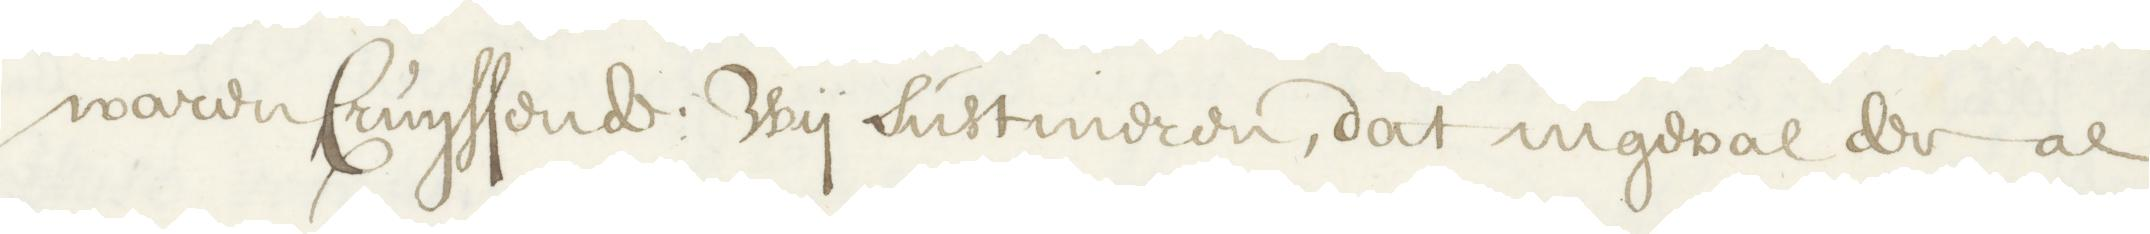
waren Cruijssende: Wij sustineren, dat ingeval der al
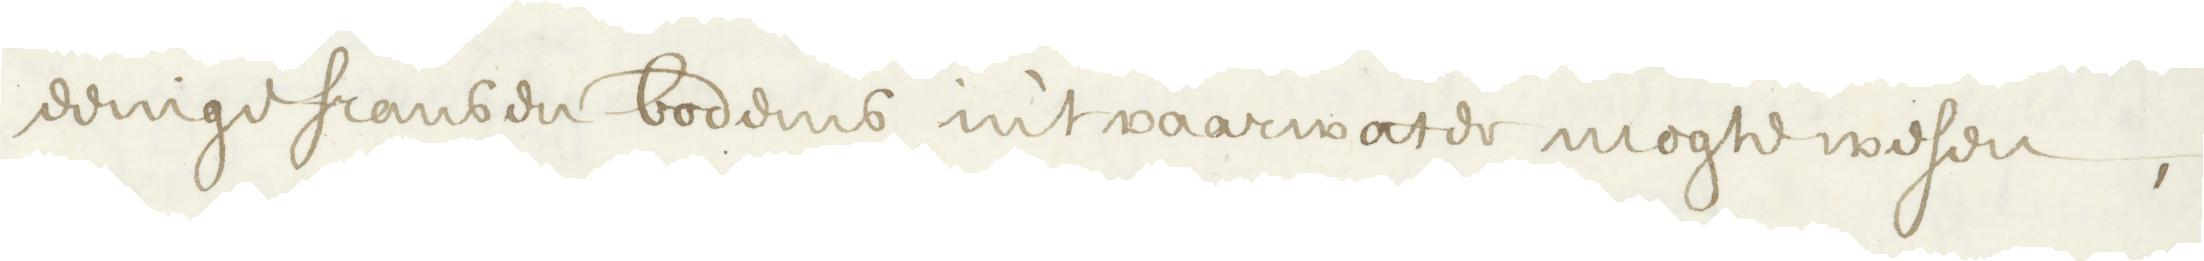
eenige fransen bodems in ’t vaarwater mogte wesen,
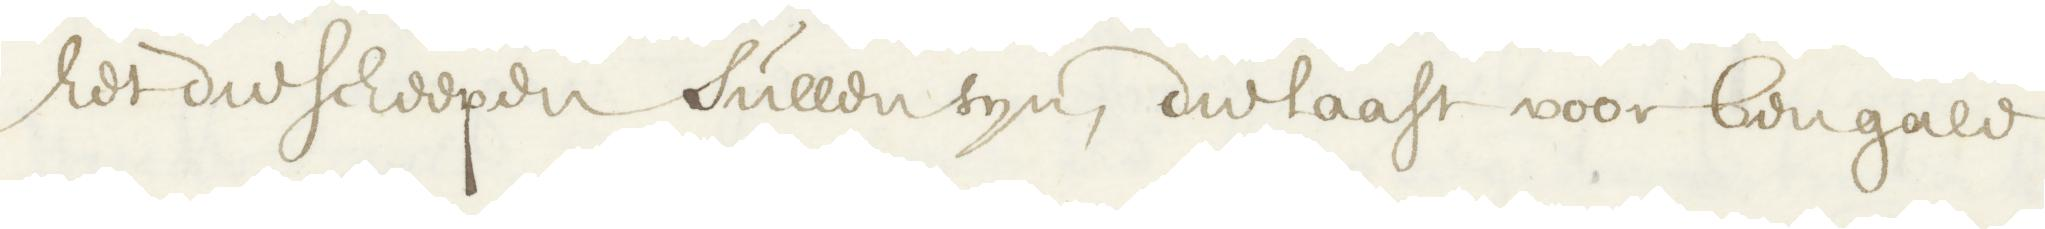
het die scheepen sullen syn, die laast voor bengale
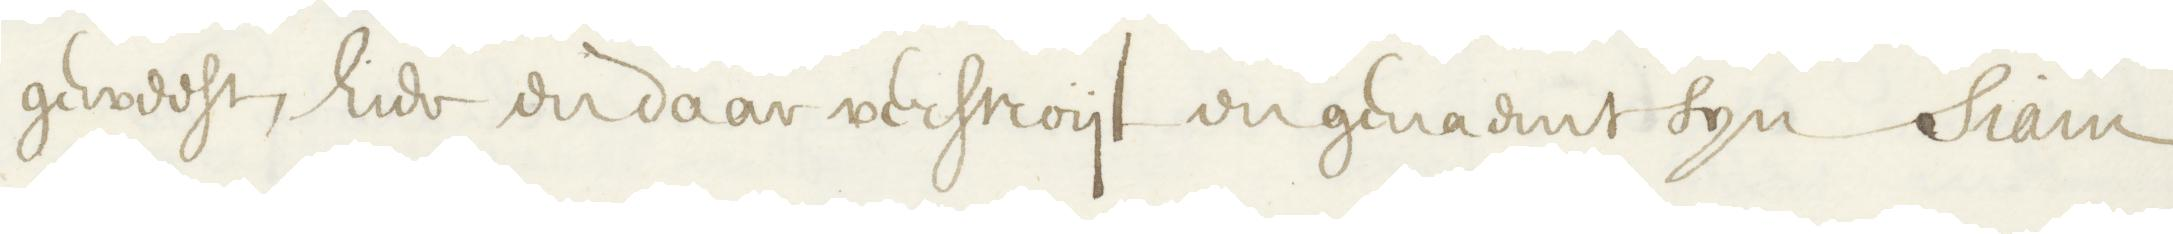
geweest, hier en daar verstroijt en genaemt syn Siam
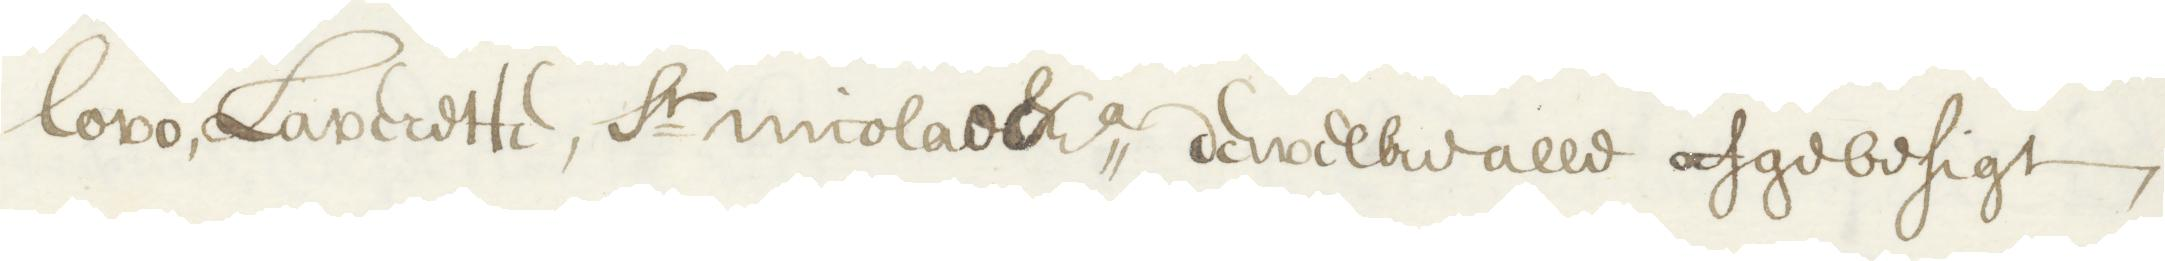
lovo, Laverette, S=t nicolae &„a dewelke alle afgebesigt,
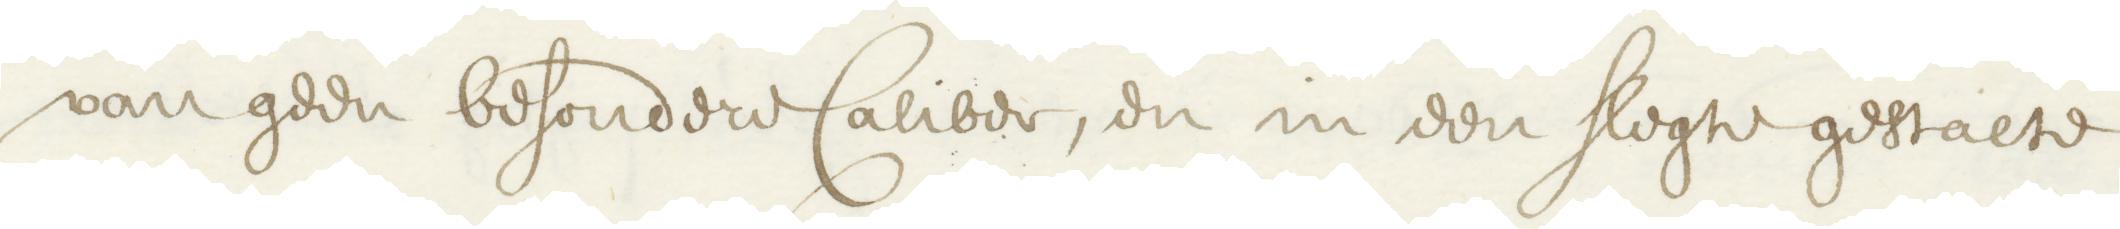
van geen besondere Caliber, en in een slegte gestalte
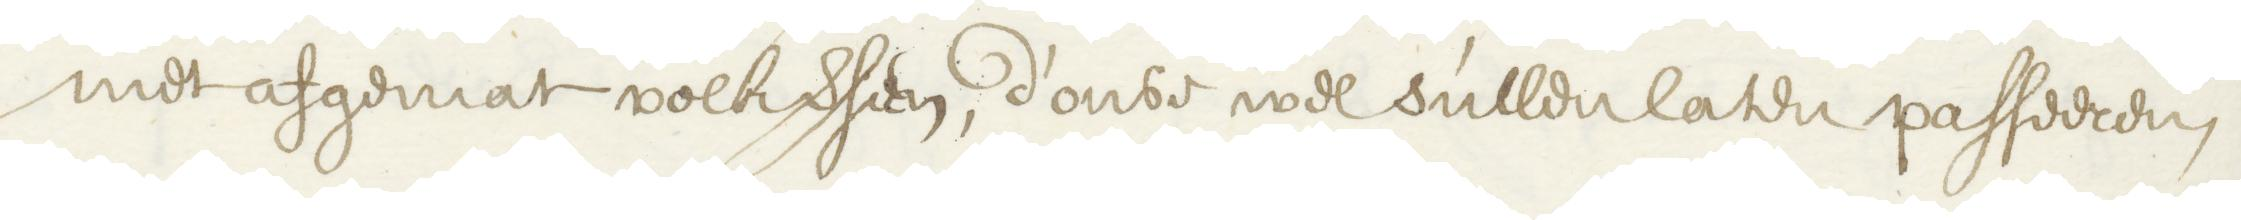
met afgemat volk versien, d’onse wel sullen laten passeeren,
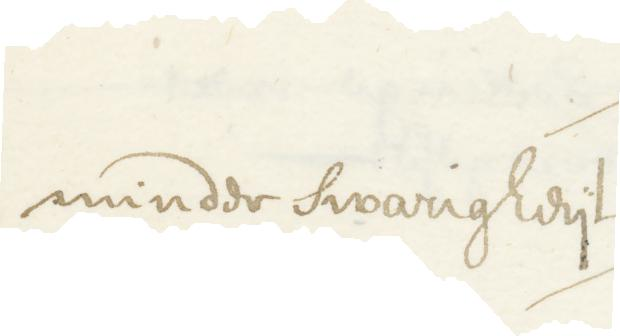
minder swarigheijt
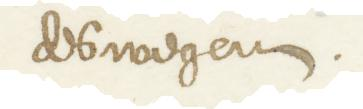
des wegen.
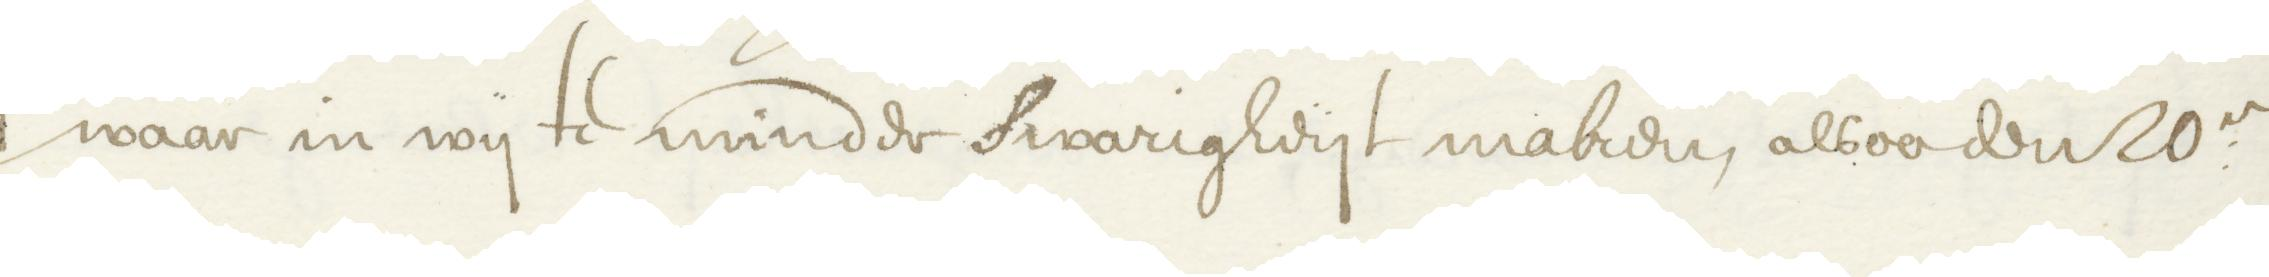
waar in wij te minder swarigheijt maken, alsoo den 20:en
